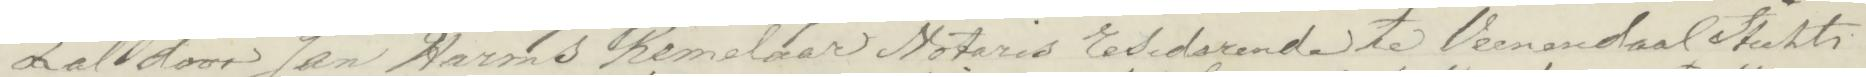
zal door Jan Harms Kemelaar Notaris residerende te Veenendaal Stichts
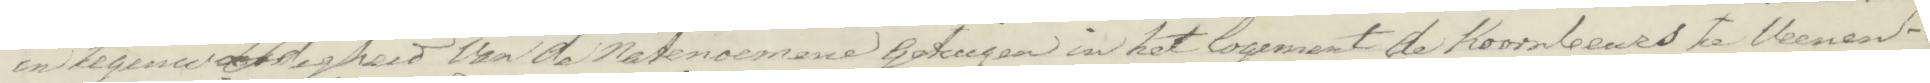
in tegenwoordigheid van de Natenoemene getuigen in het logement de Koornbeurs te Veenen-
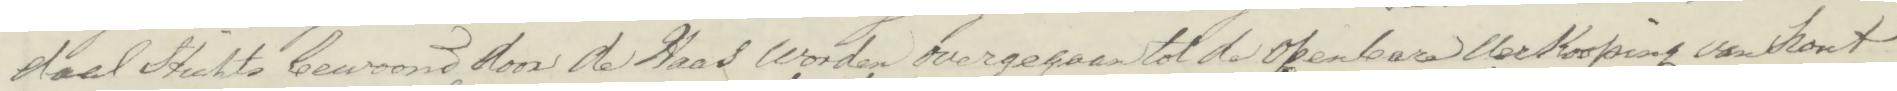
daal Stichts bewoond door de Haas worden overgegaan tot de Openbare verkooping van hout
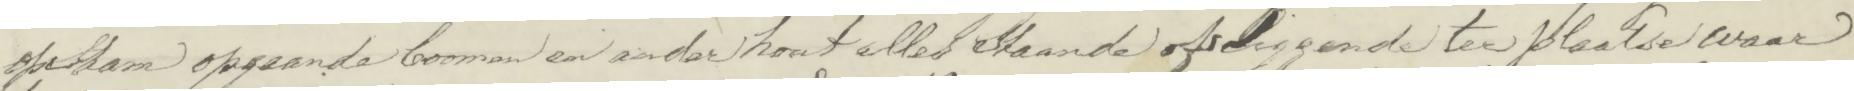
op stam opgaande boomen en ander hout alles staande of liggende ter plaatse waar
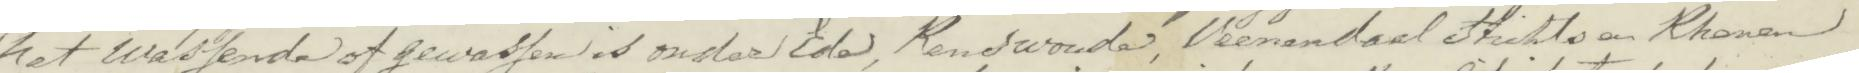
het wassende of gewassen is onder Ede, Renswoude, Veenendaal Stichts en Rhenen
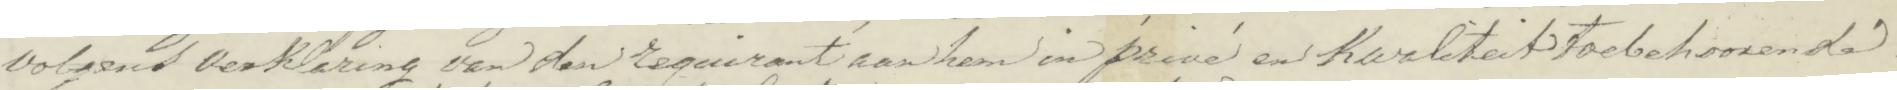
volgens verklaring van den requirant aan hem in privé en kwaliteit toebehoorende
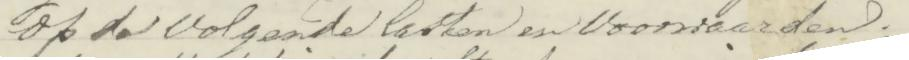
op de volgende lasten en voorwaarden.
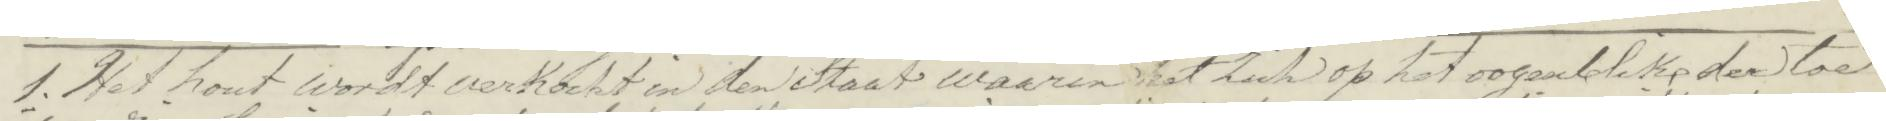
1. Het hout wordt verkocht in den staat waarin het zich op het oogenblik der toe
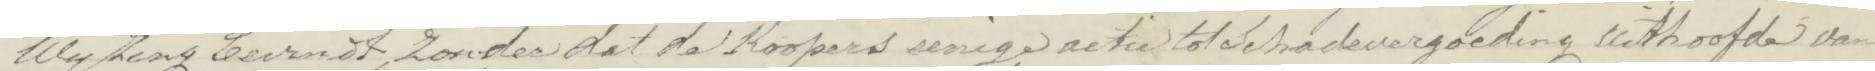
wijzing bevindt zonder dat de koopers eenige actie tot schadevergoeding uithoofde van
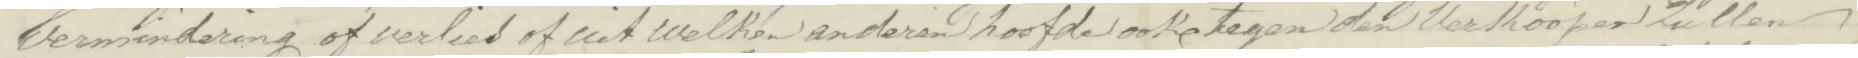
vermindering of verlies of uit welken anderen hoofde ook tegen den verkooper zullen
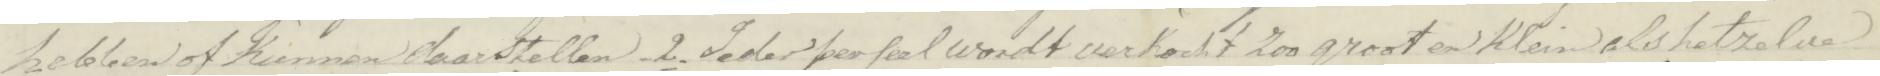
hebben of kunnen daarstellen. 2. Ieder perceel wordt verkocht zoo groot en klein als hetzelve
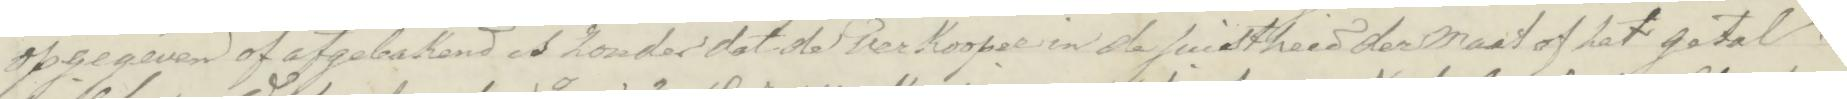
opgegeven of afgebakend is zonder dat de verkooper in de juistheid der maat of het getal
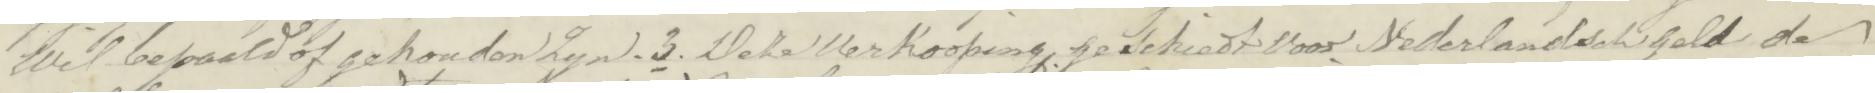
wil bepaald of gehouden zijn. 3. Deze verkooping geschiedt voor Nederlandsch geld de
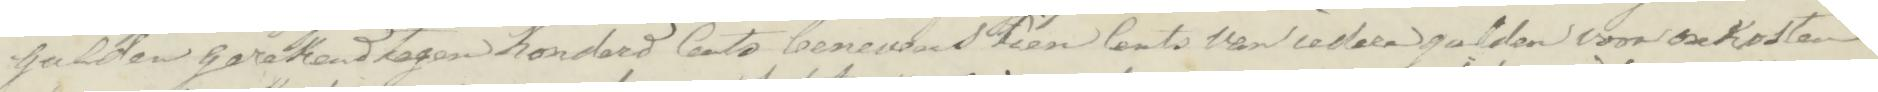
gulden gerekend tegen honderd Cents benevens tien Cents van iedere gulden voor onkosten
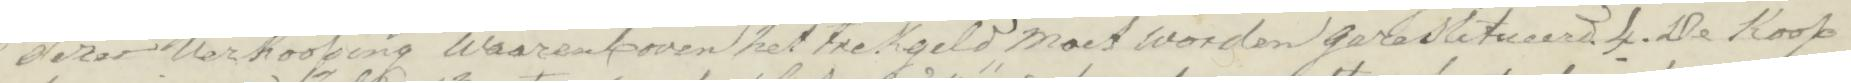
dezer verkooping waarenboven het trekgeld moet worden gerestitueerd 4. De koop
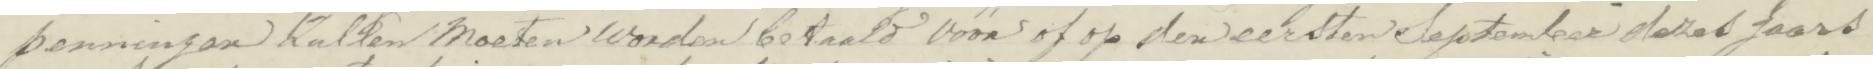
penningen zullen moeten worden betaald vóór of op den eersten September dezes Jaars
